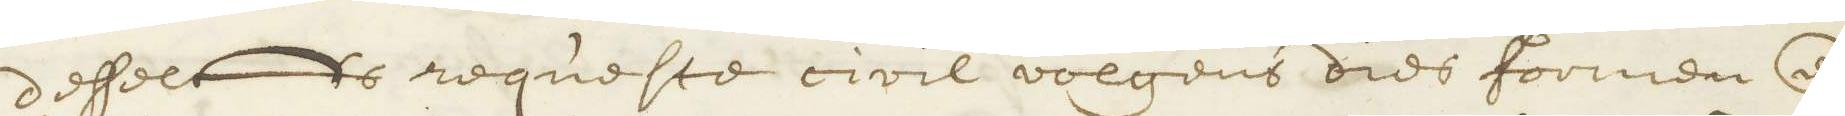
desselffs requeste civil volgens dies formen ende
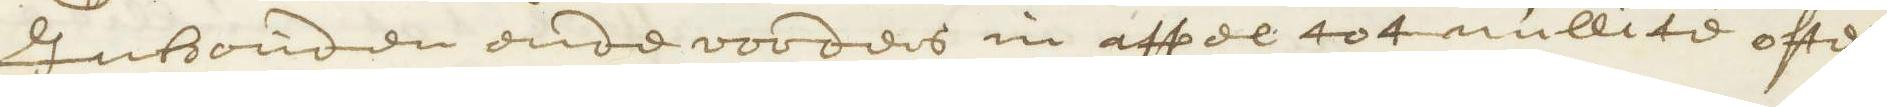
Jnhouden ende vorders in appel tot nullité ofte
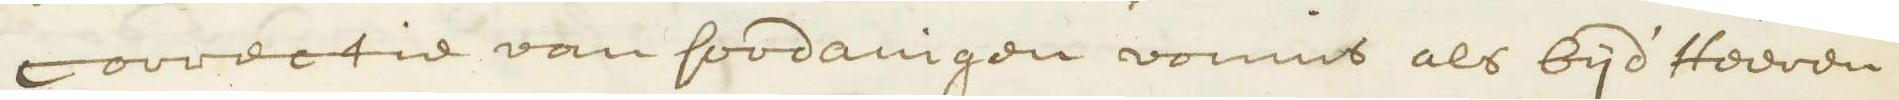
correctie van soodanigen vonnis als bij d’ Heeren
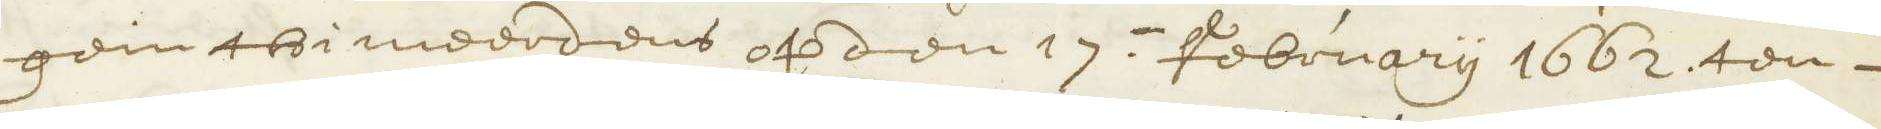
geinthineerdens op den 17.' februarij 1662 .ten -
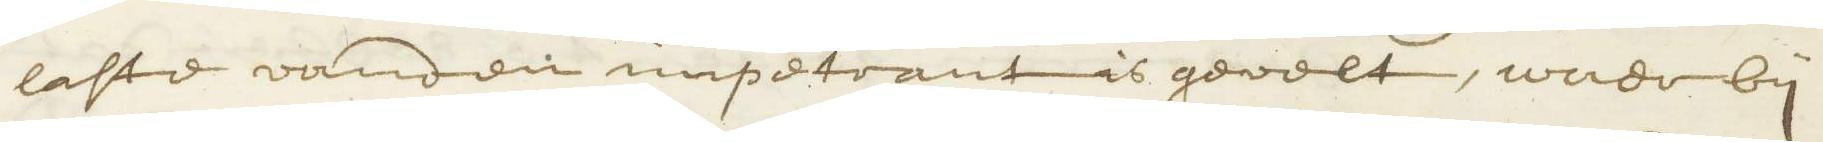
laste vanden impetrant is gevelt, waer bij
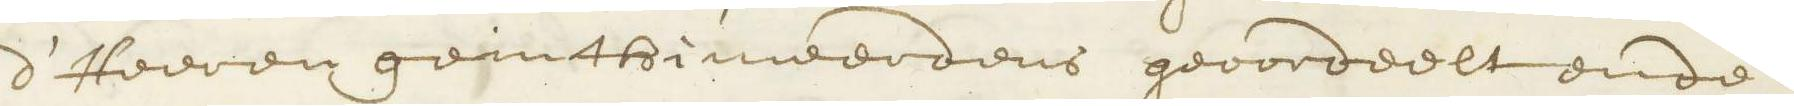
d’ Heeren geinthimeerdens geoordeelt ende
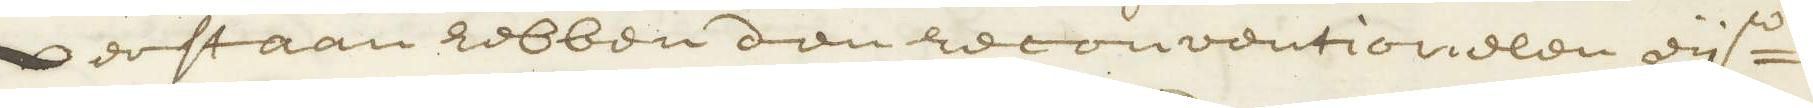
verstaan hebben den reconventionelen eij=r
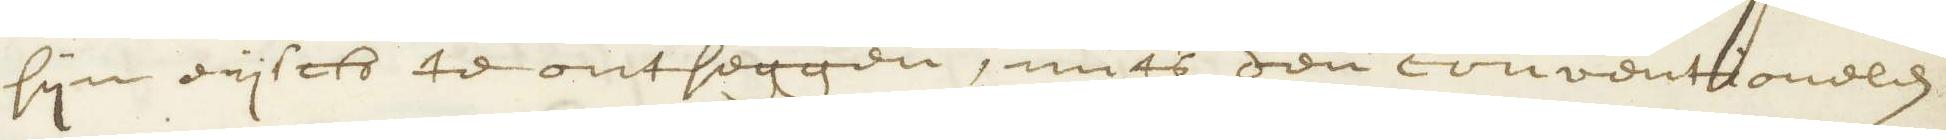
sijn eijsch te ontseggen, mits den conventionelen
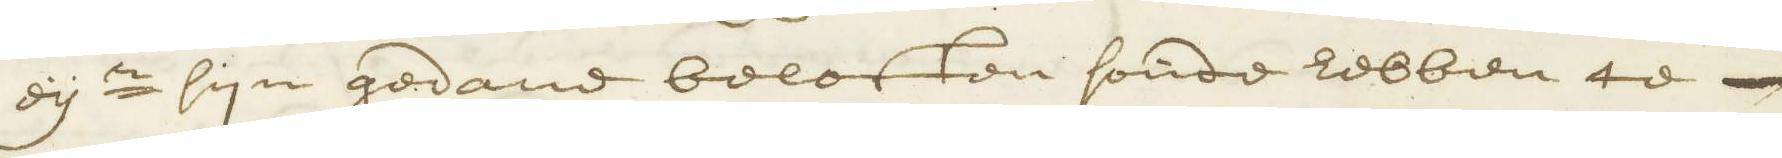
eij=r sijn gedane beloften soude hebben te —
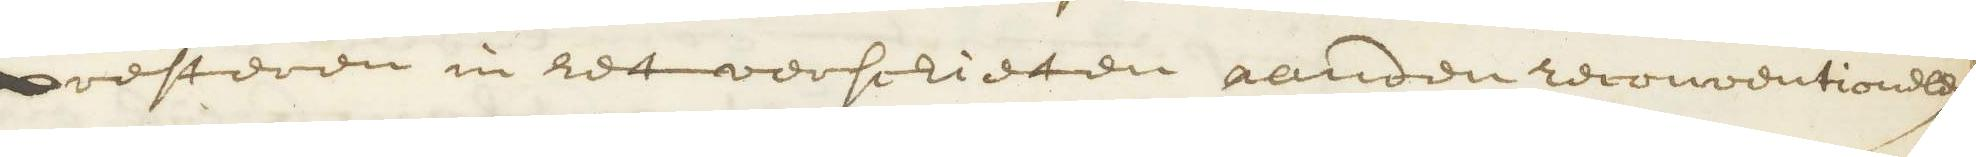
presteren in het verschieten aanden reconventionelen
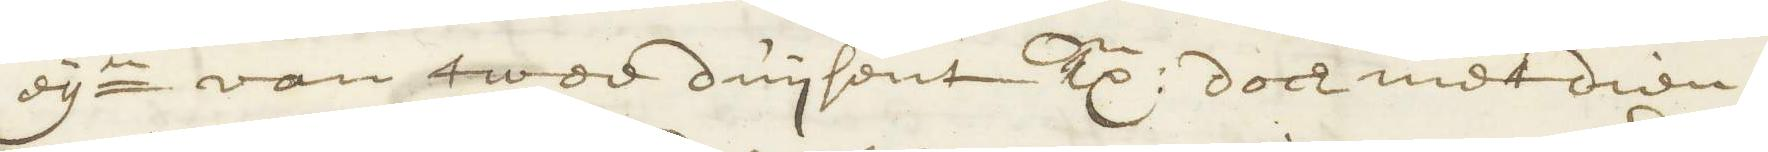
eij=r van twee duijsent rx: doch met dien
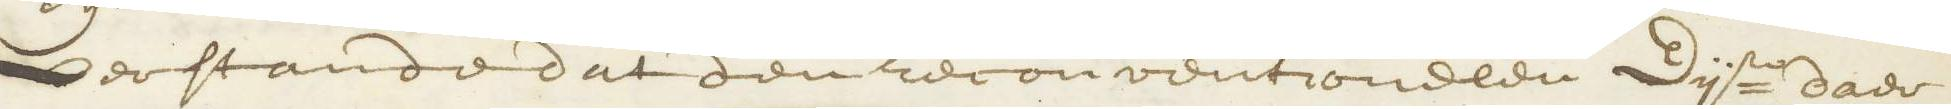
verstande dat den reconventionelen Eij=r daer
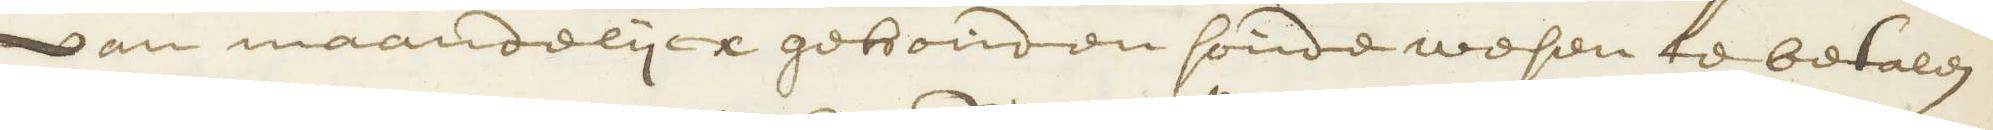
van maandelijcx gehouden soude wesen te betalen
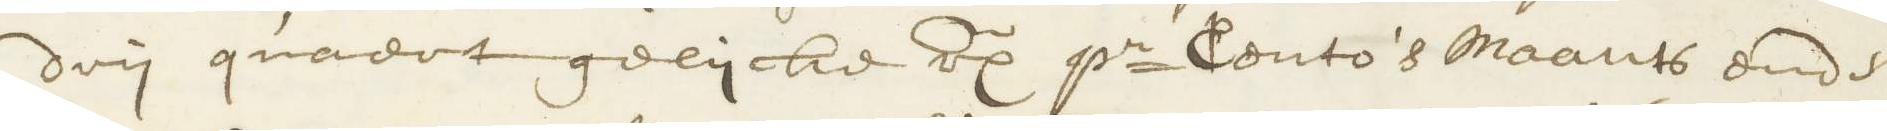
drij quaert gelijcke rx p=r Conto 's maants ende
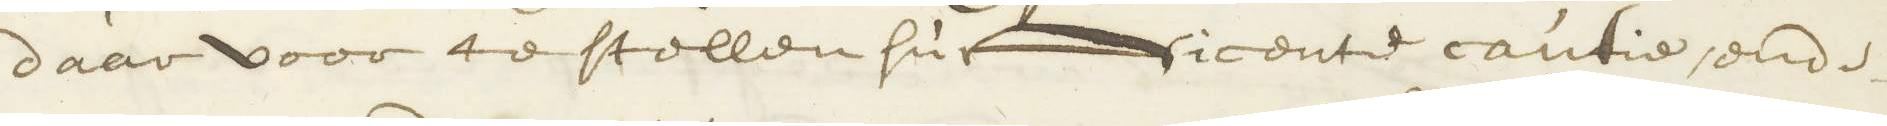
daar voor te stellen sufficente cautie, ende
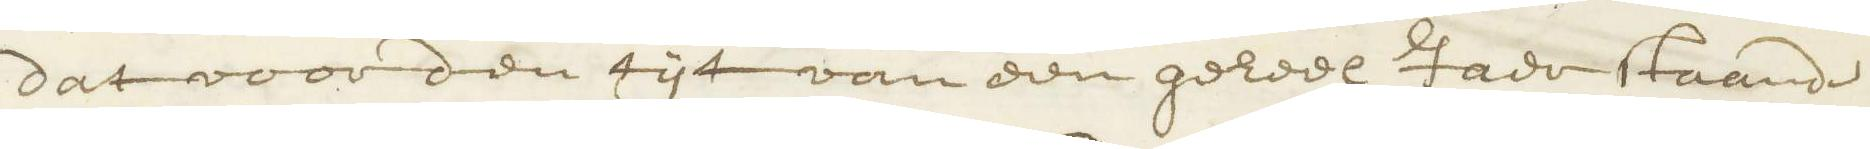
dat voor den tijt van een geheel Jaer staande
